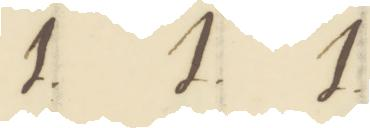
1. 1. 1.
